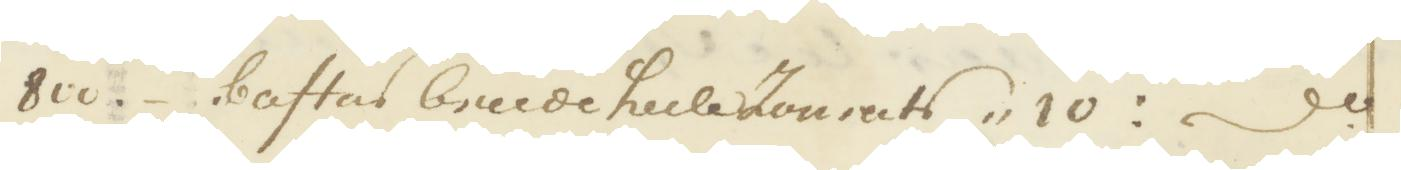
800. – baftas breede heele Zourats „ 10: _.o
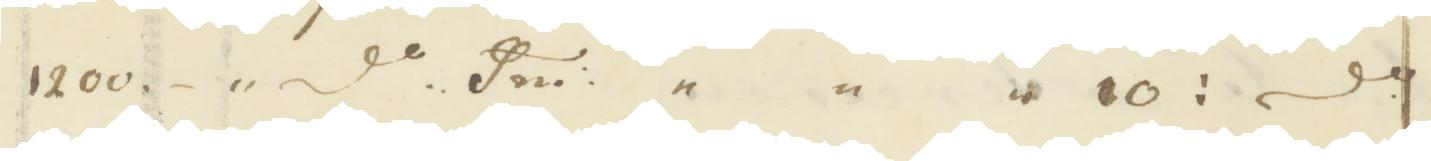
1200. – „ _:o sm: „ „ „ 10: _.o
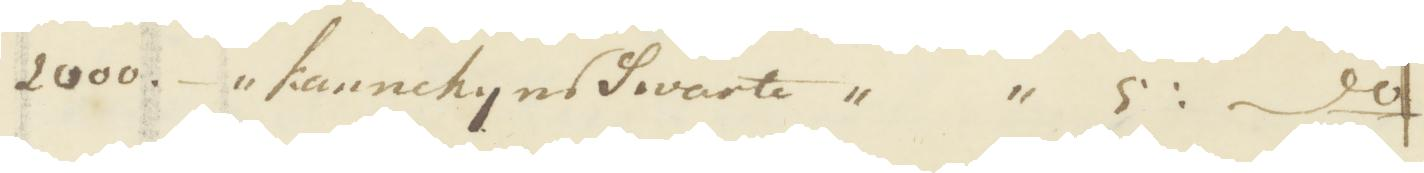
2000. – „ kannekyns swarte „ „ 5: _o
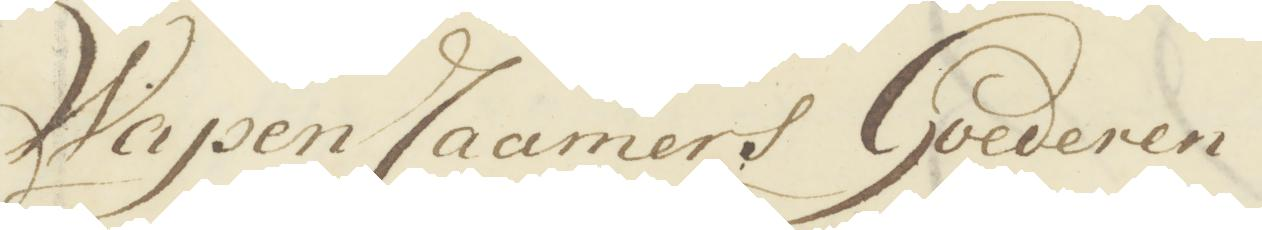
Wapen Caamers Goederen.
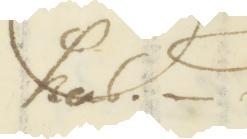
1/ kas. –
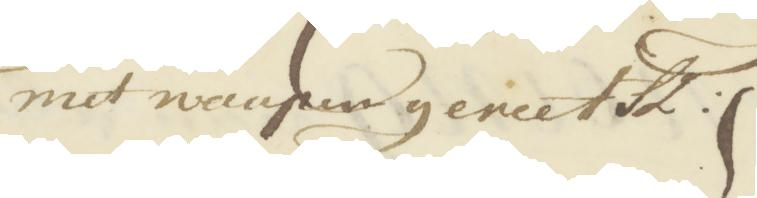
met waapen gereetsz:
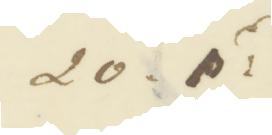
20 p:s –
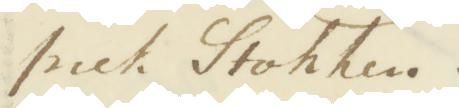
piek stokken.
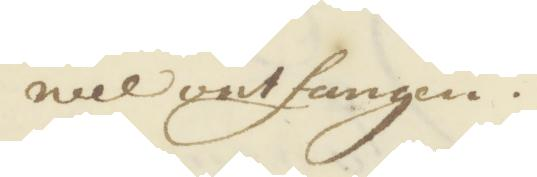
wel ontfangen.
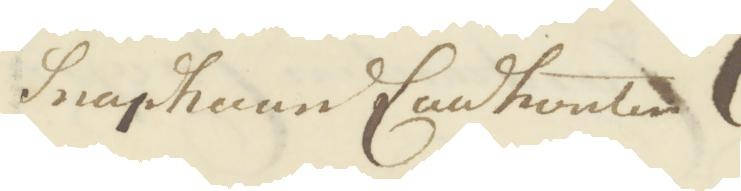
snaphaan Caahorten
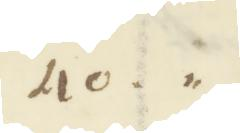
40. „ –
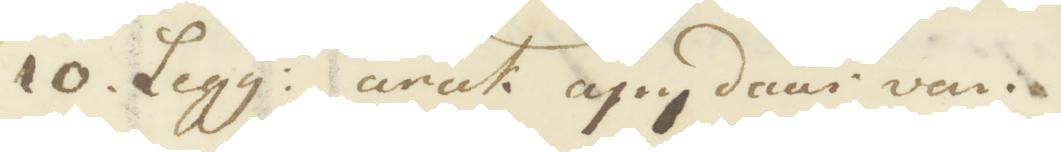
10. legg:s arak apy daar van:
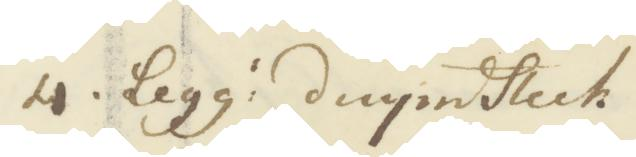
4. legg:' duijmsteek
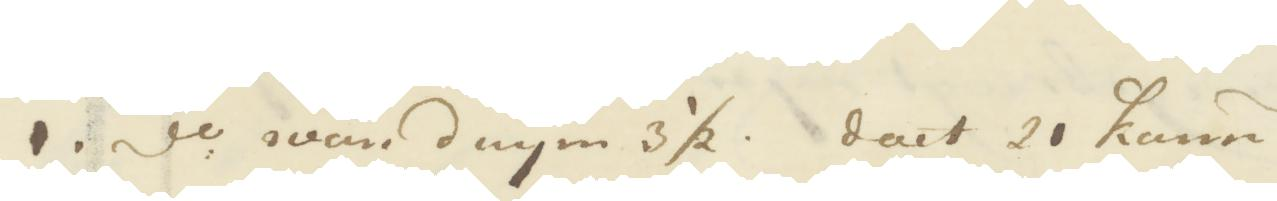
1. _:o wan duijm 3½. daet 21 kann:
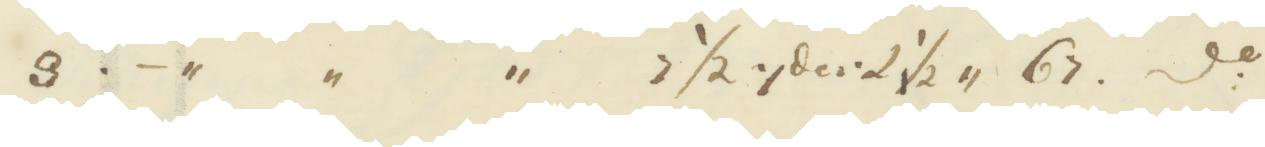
3. – „ „ „ 7½ yder 2½ „ 67. _:o
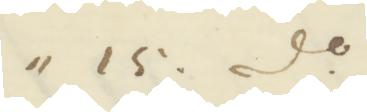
„ 15. _.o
